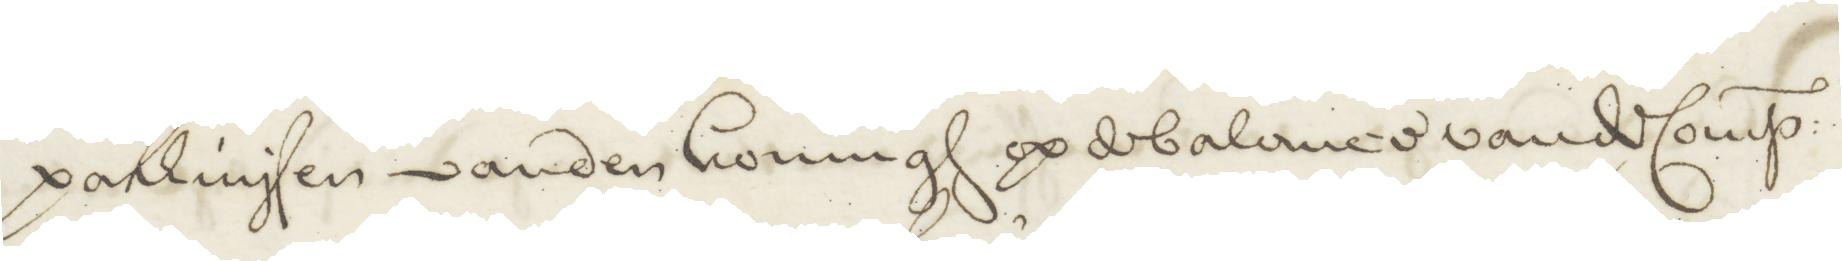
pakhuijsen van den koningh op de balance van de Comp:
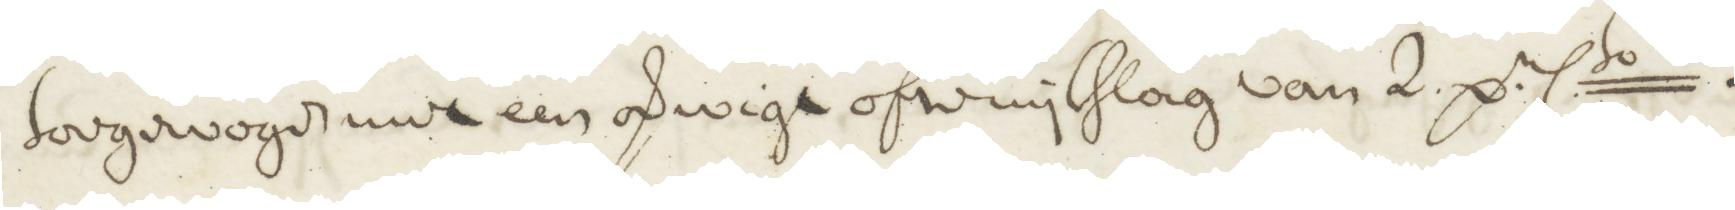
toegewogen met een overwigt ofte uijtslag van 2. p.r C=to
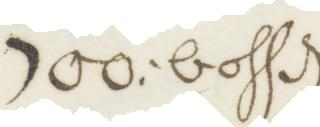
700: bossen
